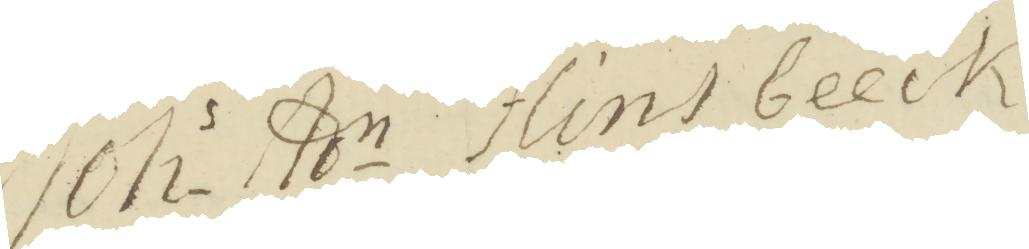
Joh-s Ad-n Hins beeck
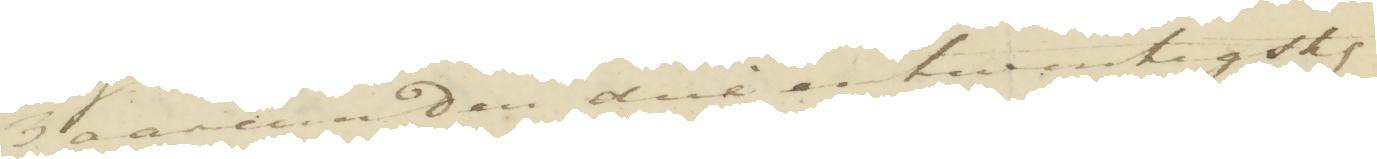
Haarlem den drie en twintigste
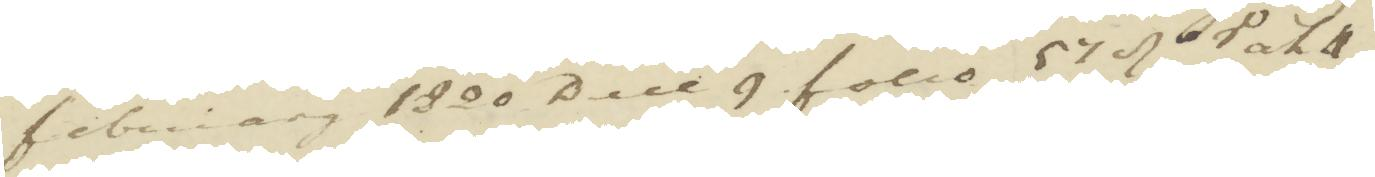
februarij 1800 Deel 9 fol.o 57 V Vak 4
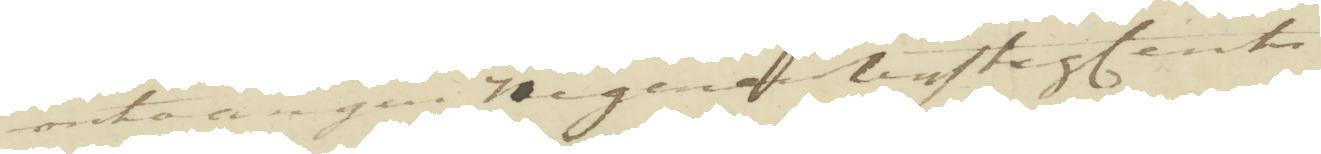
ontvangen Negen en Vyftig Cents
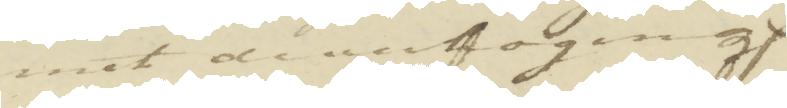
met de verhoging.
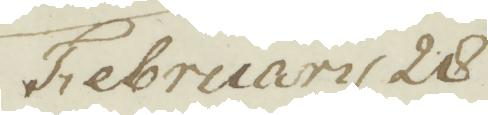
Februarij 28
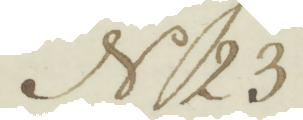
N 23
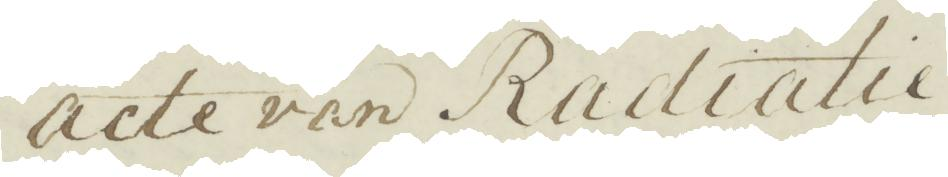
acte van Radiatie
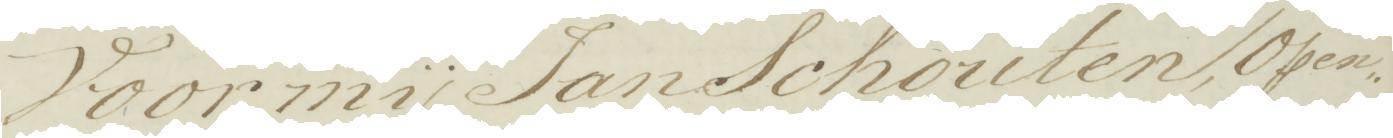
Voor mij Jan Schouten, Open„
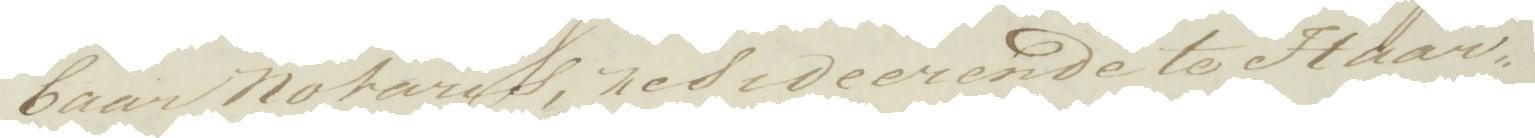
baar Notaris, resideerende te Haar„
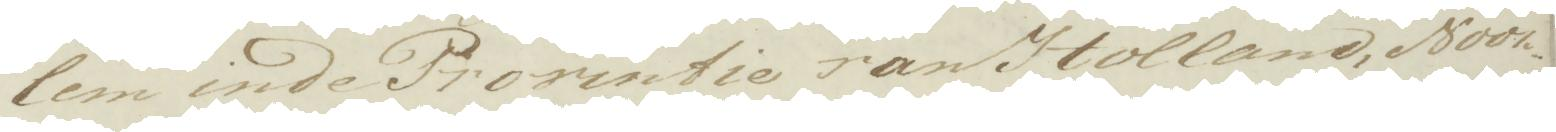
lem in de Provintie van Holland, Noor„
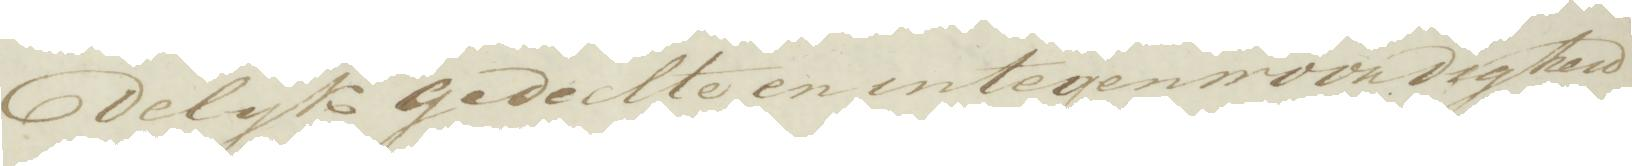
delijk gedeelte en in tegenwoordigheid
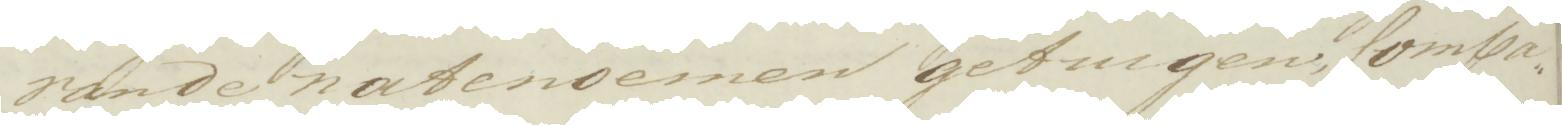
van de na ten oemen getuigen, Compa„
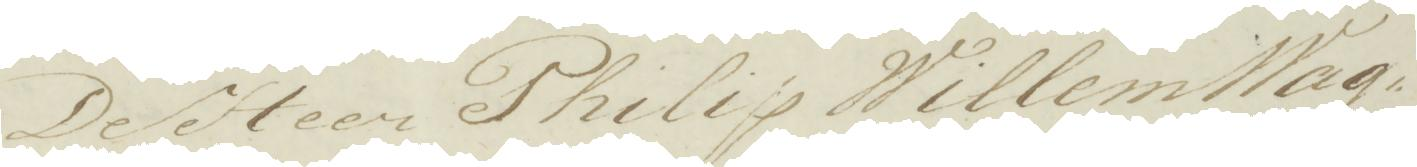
De Heer Philip Willem Wag„
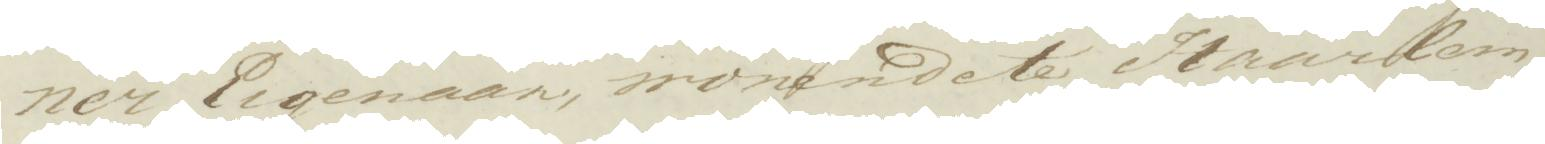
ner, Eigenaar, wonende te Haarlem
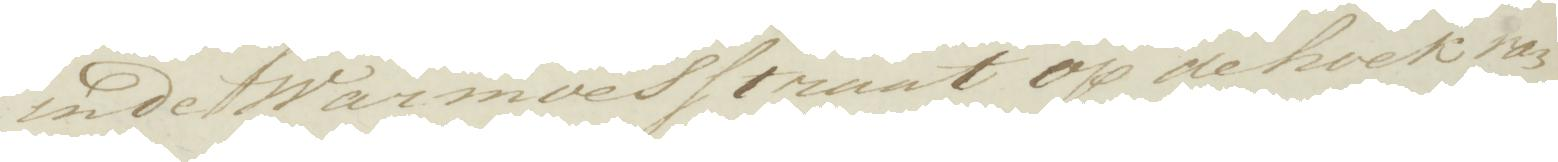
in de Warmoesstraat op de hoek van
